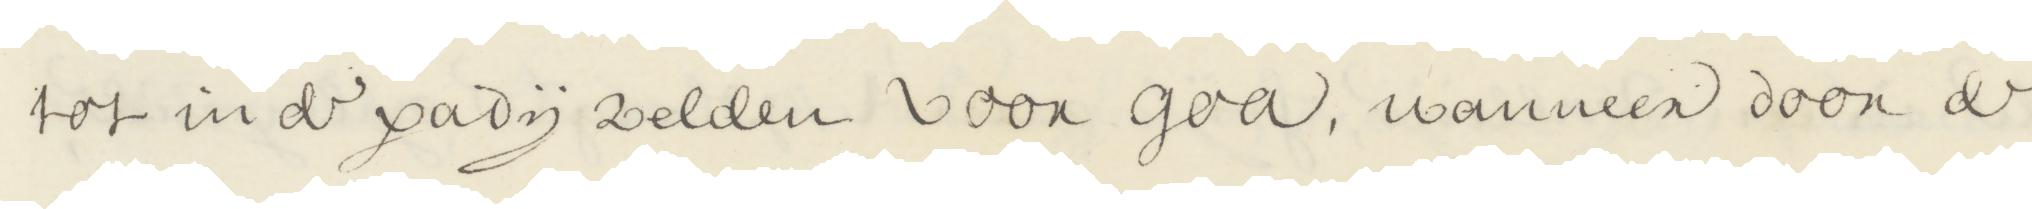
tot in de padij velden voor goa, wanneer door de
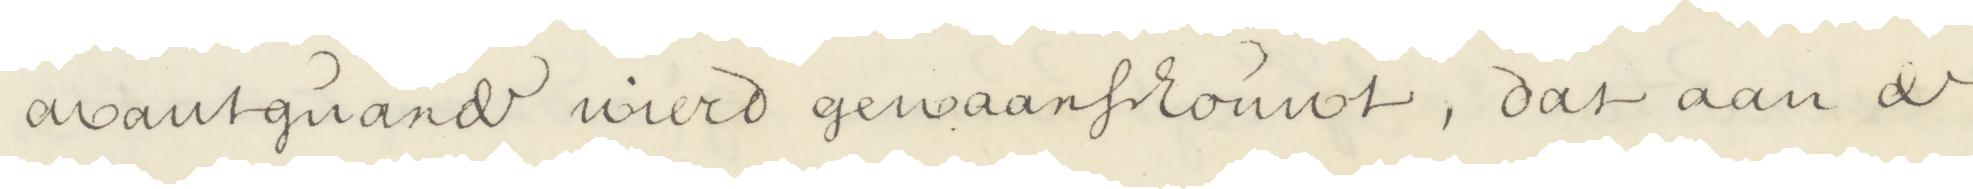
avantguarde wierd gewaarschouwt, dat aan de
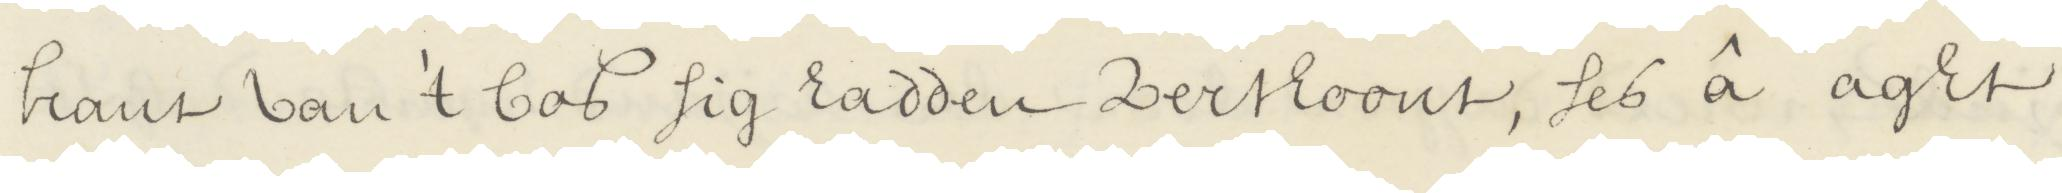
kant van ’t bos sig hadden verthoont, ses â aght
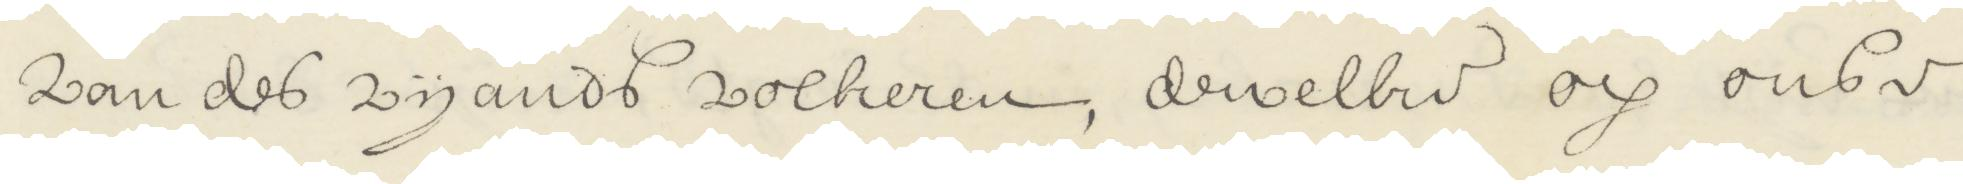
van des vijands volkeren, dewelke op onse
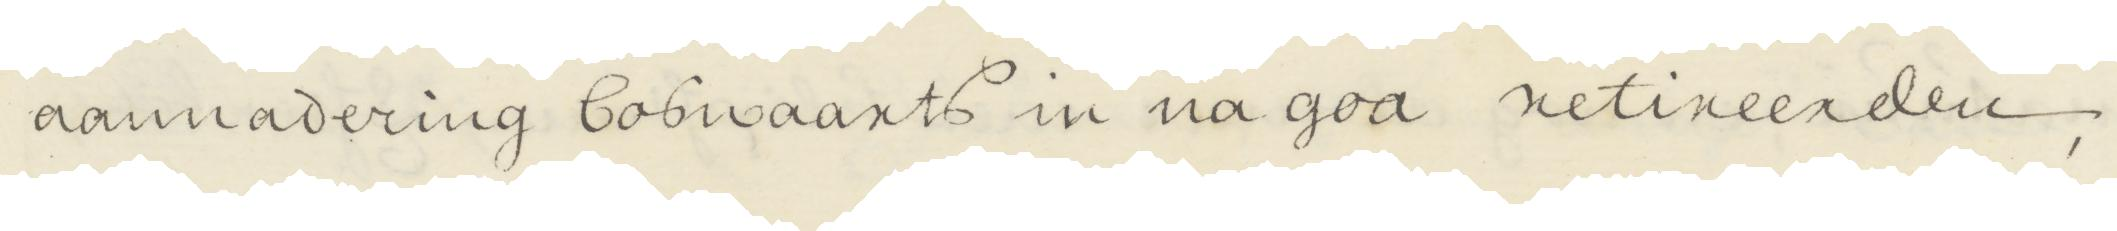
aannadering boswaarts in na goa retireerden,
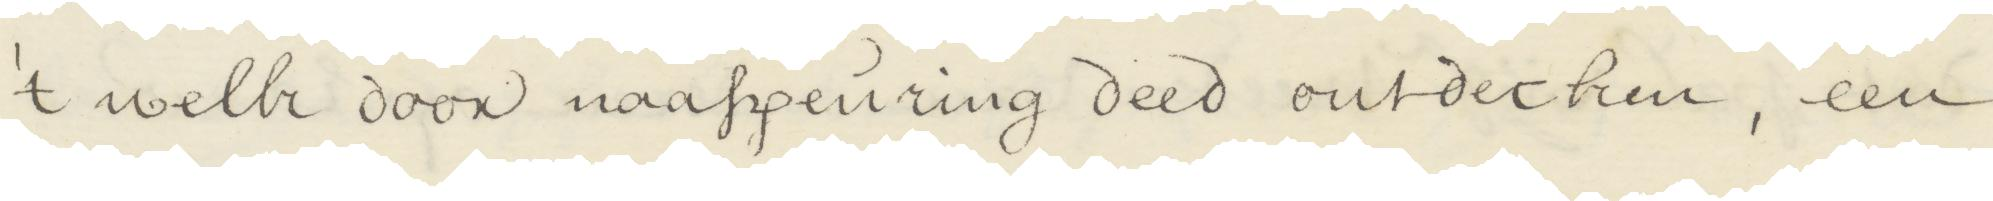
’t welk door naaspeuring deed ontdecken, een
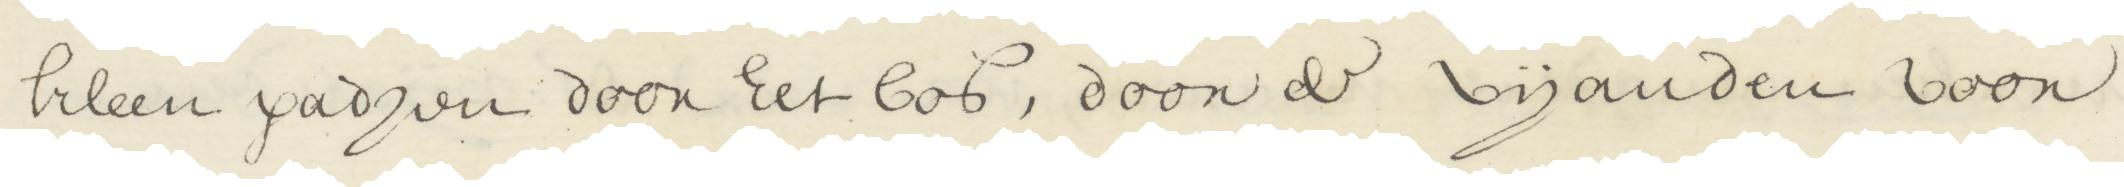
kleen padjen door het bos, door de vijanden voor
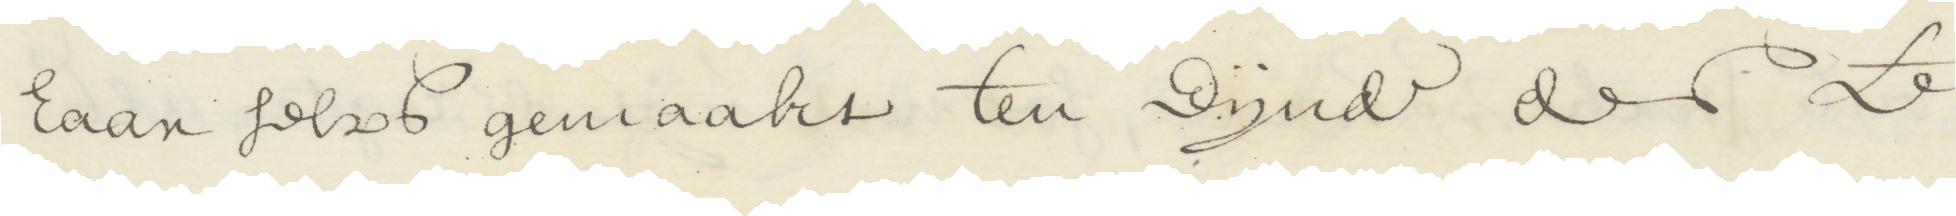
haar selvs gemaakt ten Eijnde des te
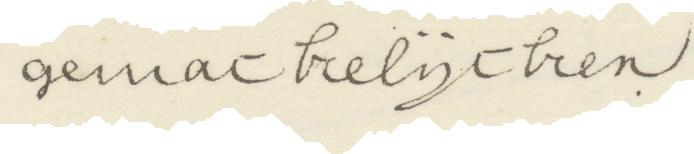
gemackelijcker
